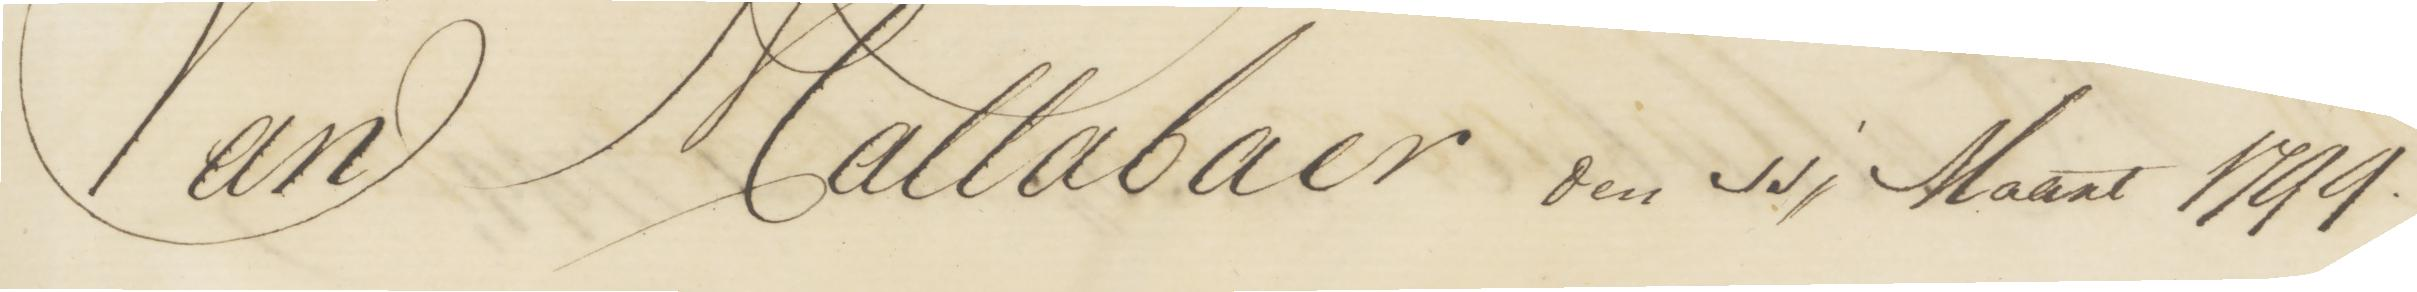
Van Mallabaer den 11„' Maart 1744:
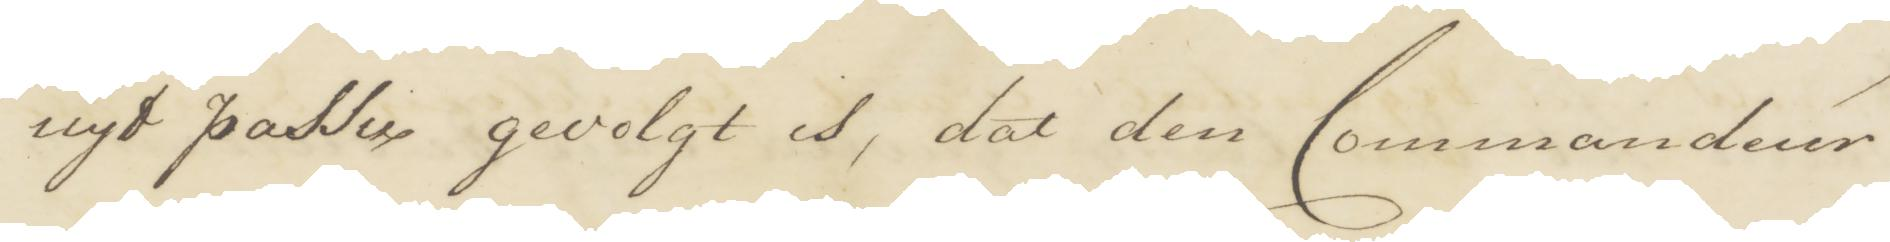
uijt passie gevolgt is, dat den Commandeur
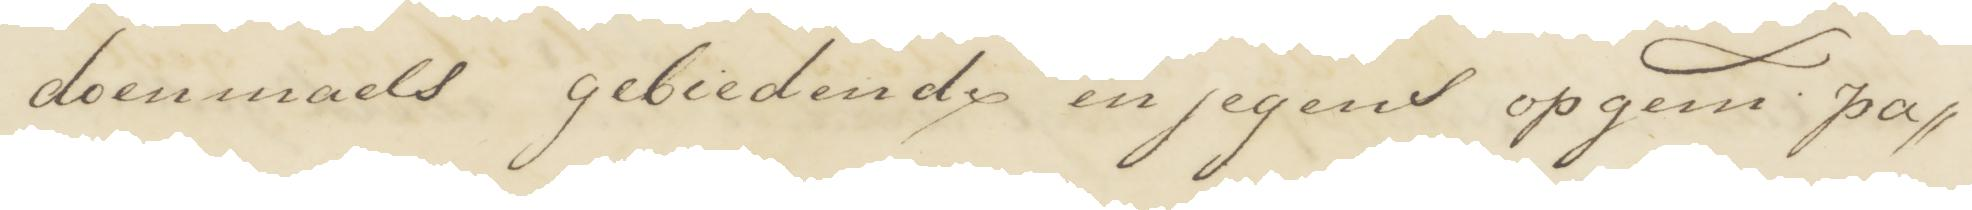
doenmaels gebiedende en jegens opgem: pa
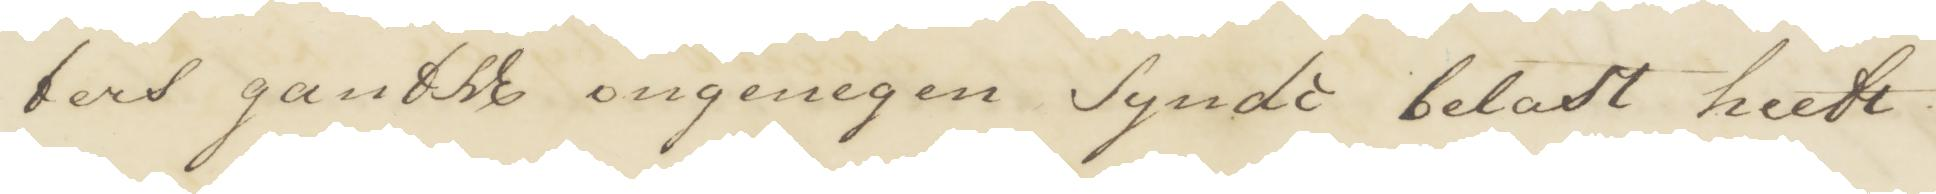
ters gantsch ongenegen sijnde belast heeft.
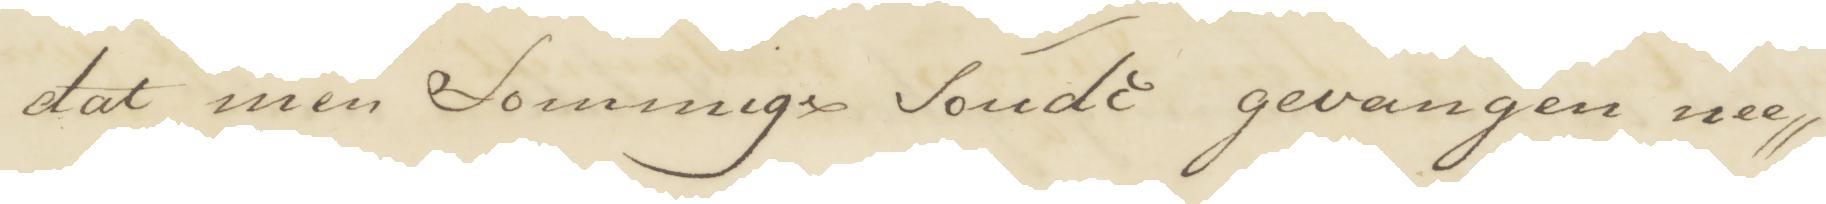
dat men sommige soude gevangen nee„
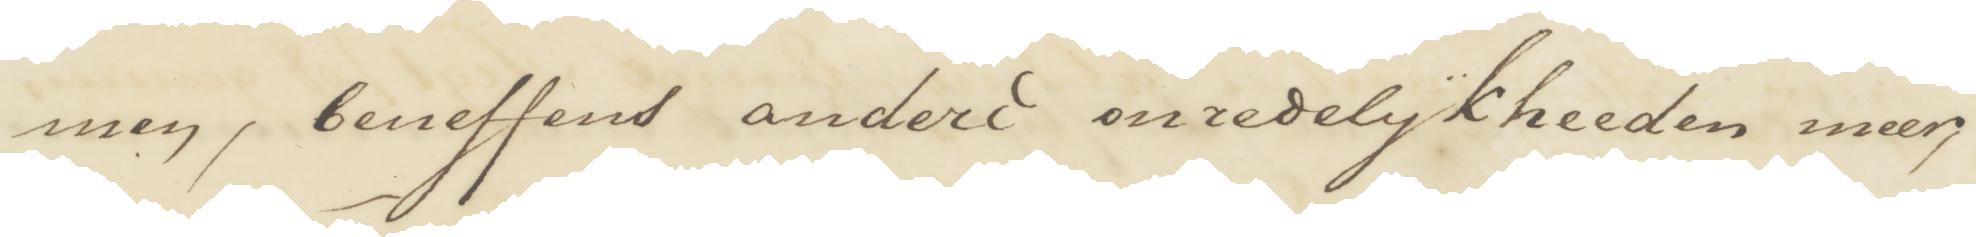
men, beneffens andere onredelijkheeden meer,
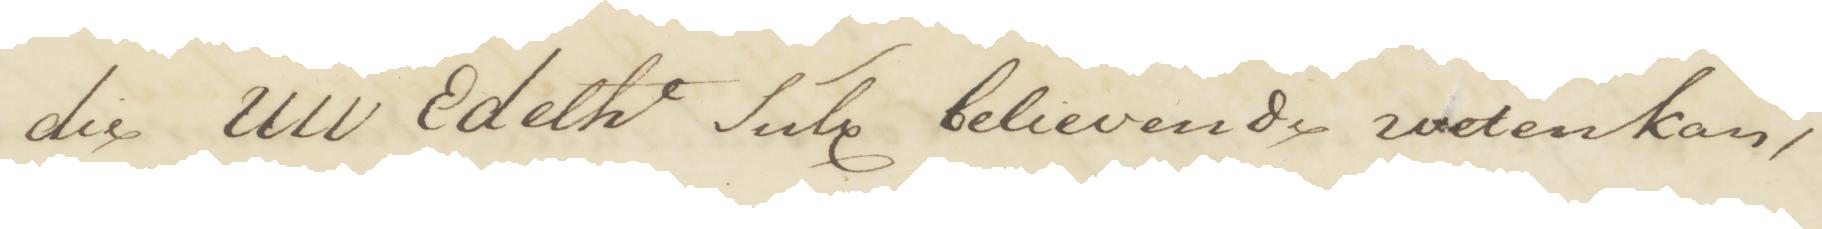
die UW Edelht sulx believende wetenkan,
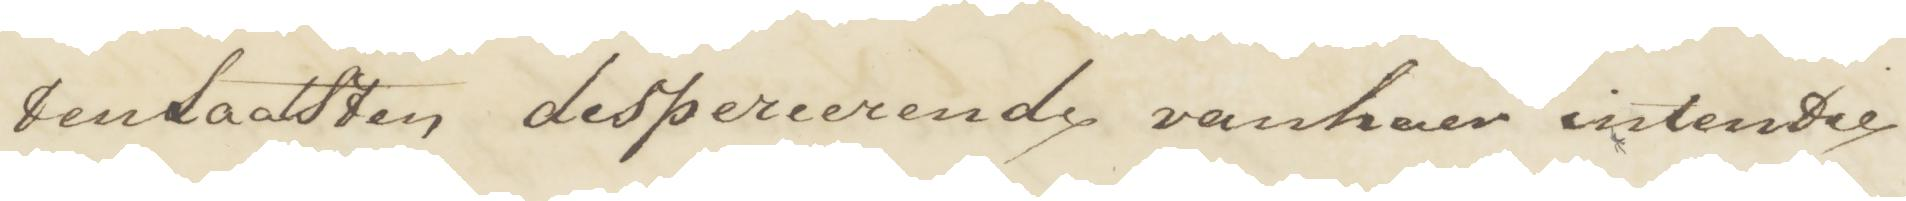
ten laatsten despereerende van haer intentie
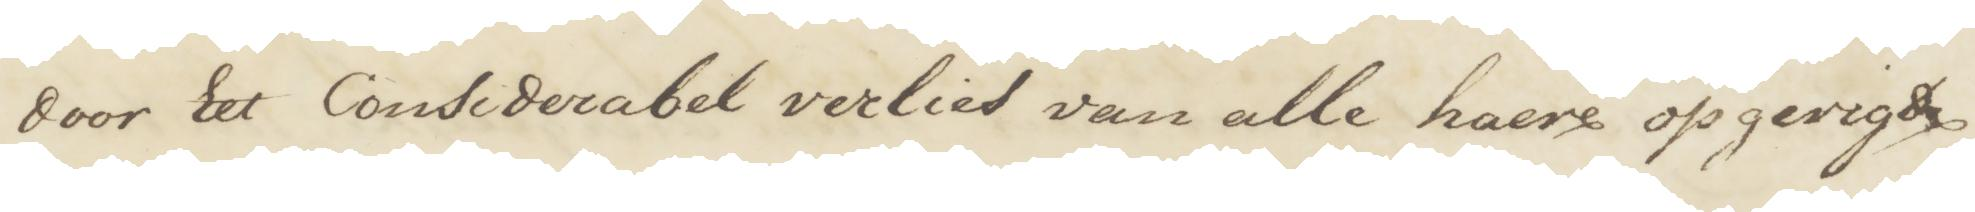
door het Considerabel verlies van alle haere opgerigt
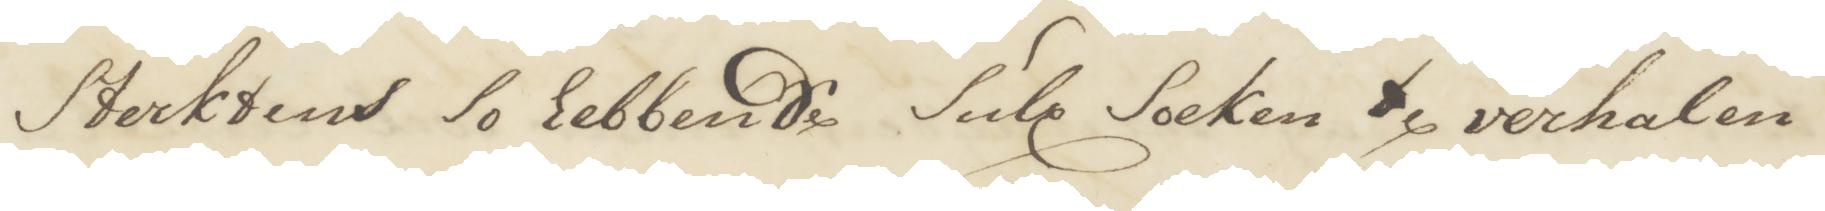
sterktens so hebbende sulx soeken te verhalen
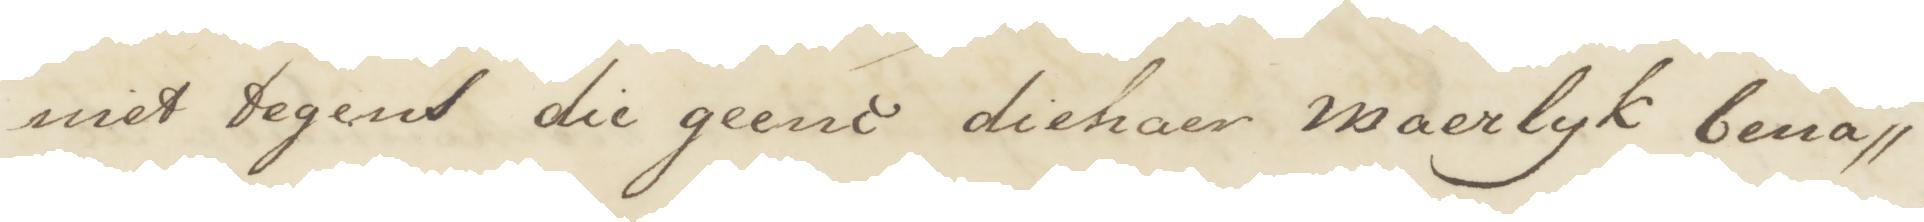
niet tegens die geene diehaer waerlijk bena„
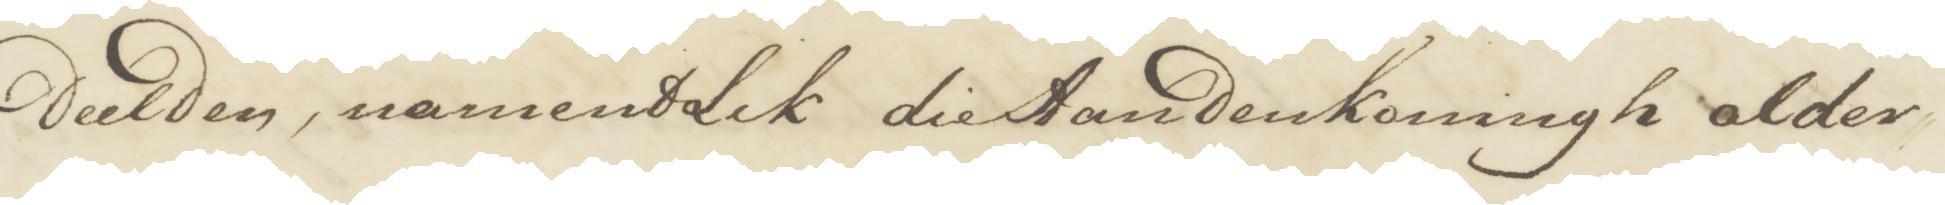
deelden, namendlik die Aan denkoningh alder
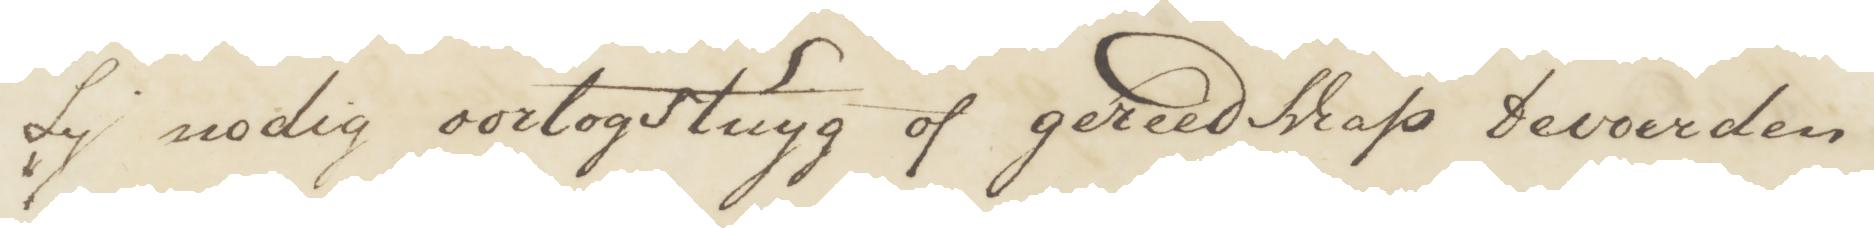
„lij nodig oorlogstuijg of gereedschap tevoerden
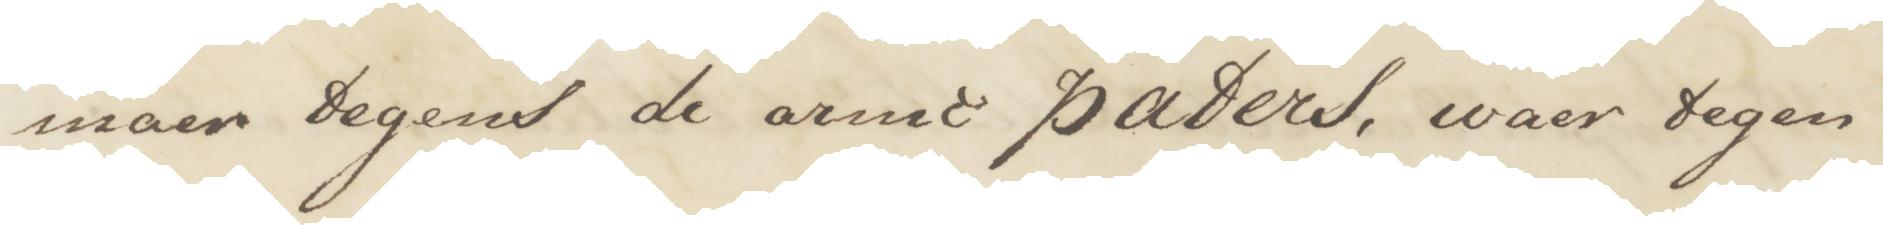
maer tegens de arme Paters, waer tegen
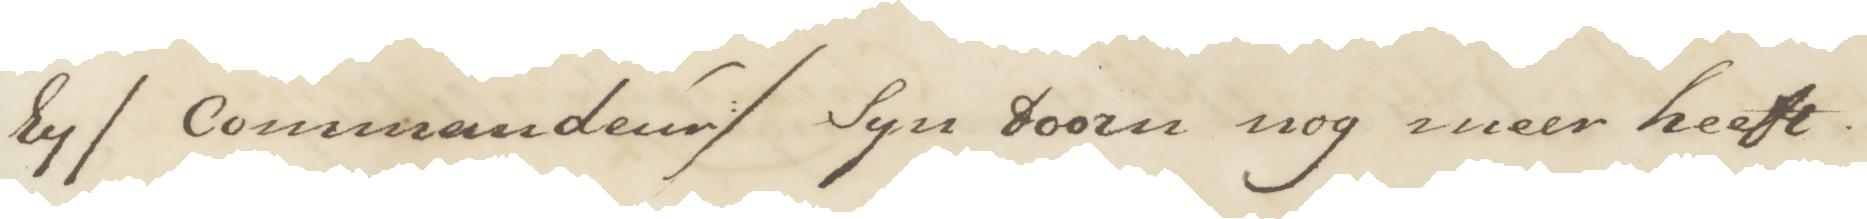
hij / Commandeur:/ syn toorn nog meer heeft
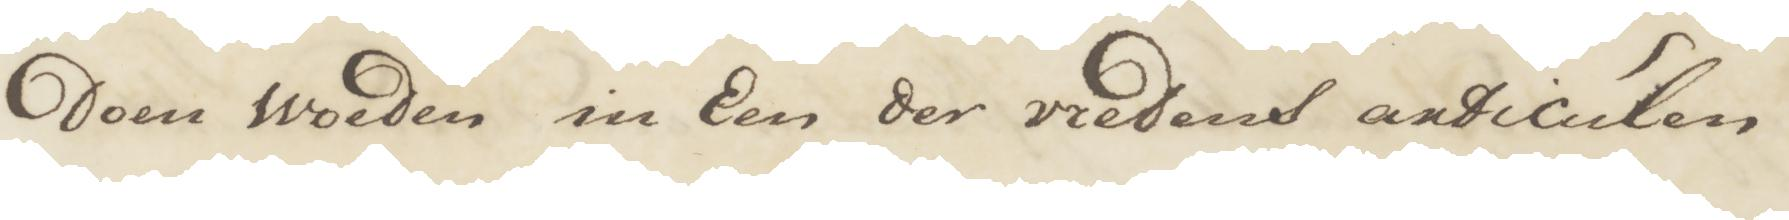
doen woeden in Een der vredens articulen
